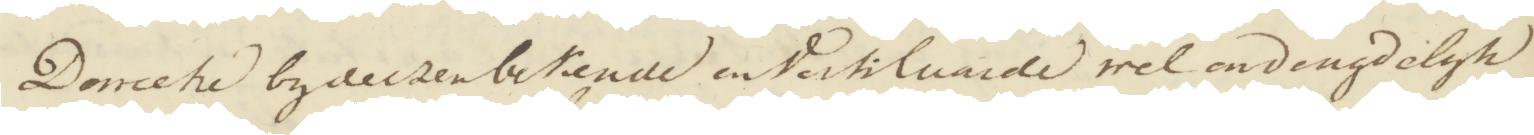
Dewelke by deezen bekende en Verklaarde wel ondeugdelyk
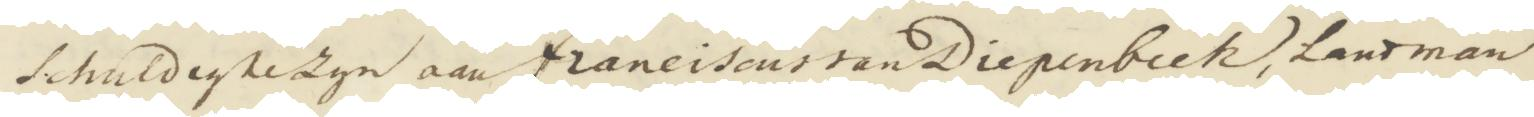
schuldig te zyn aan Franciscus van Diepenbeek, Landman
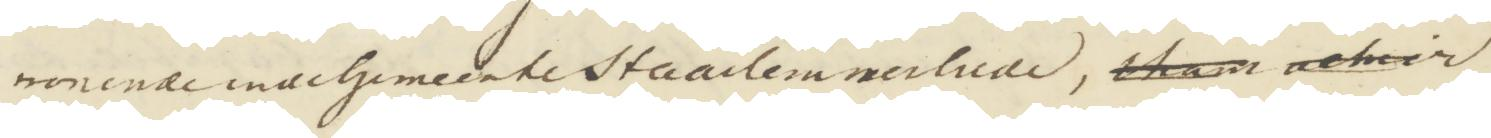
wonende in de Gemeente Haarlemmerliede, thans alhier
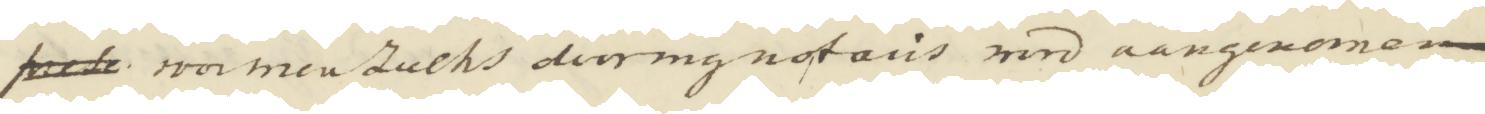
prese voor men zulks door my notaris word aangenomen
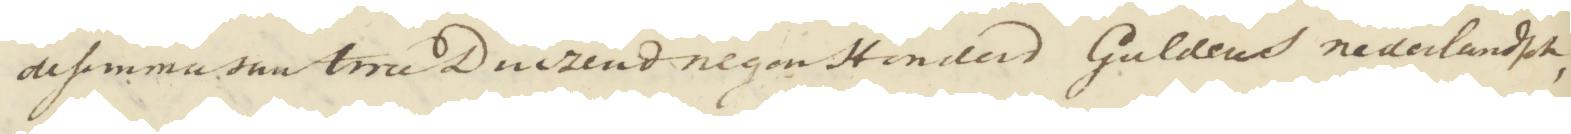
de somma van twee Duizend negen Honderd Guldens nederlandsch,
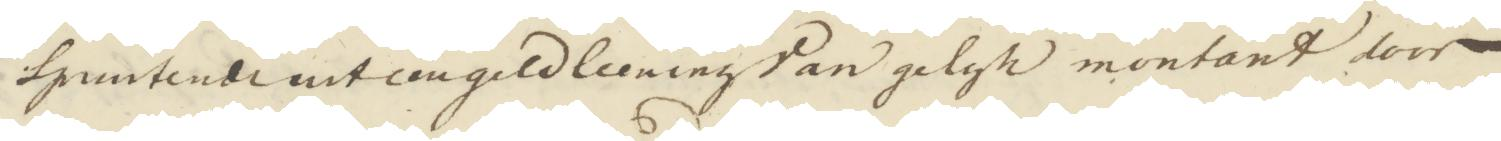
spuntende uit een geldleening van gelyk montant door
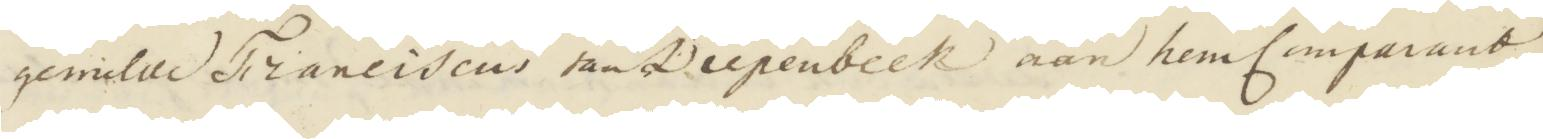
gemelde Franciscus van Diepenbeek aan hem Comparant
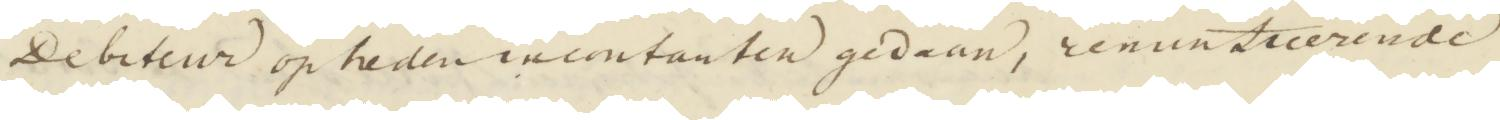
Debiteur op heden in contanten gedaan, renuntieerende
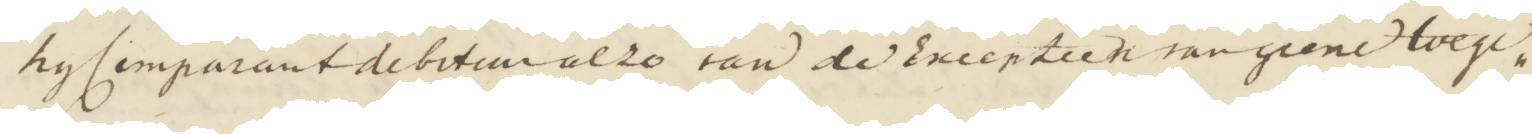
hy Comparant debiteur alzo van de Exceptien van geene toege„
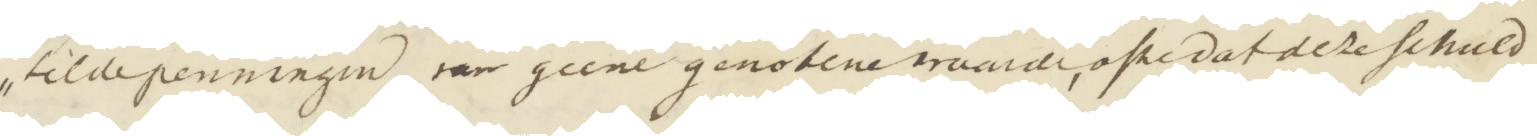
„telde penningen, van geene genotene waarde, ofte dat deze schuld
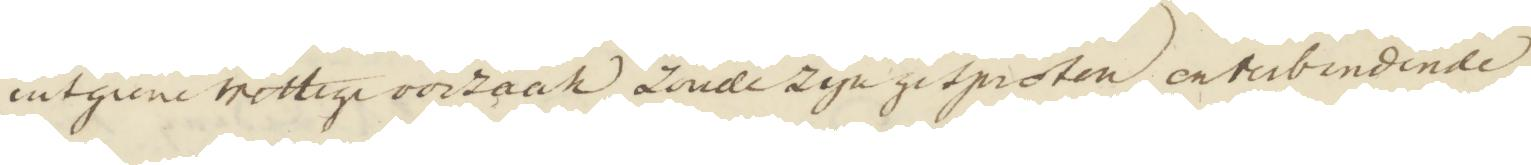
uit geene wettige oorzaak zoude zyn gesproten, en verbindende
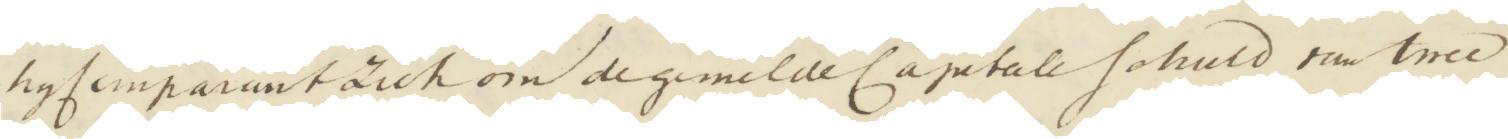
hy Comparant zich om de gemelde Capitale schuld van twee
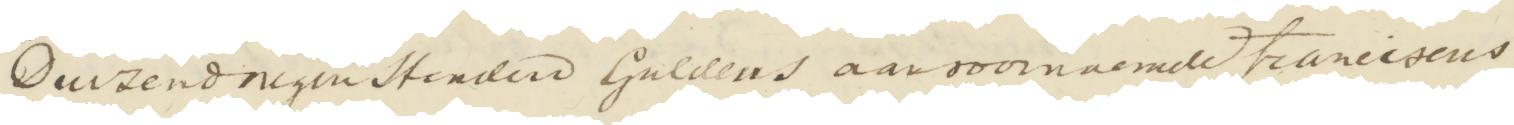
Duizend negen Honderd Guldens aan voornoemde franciscus
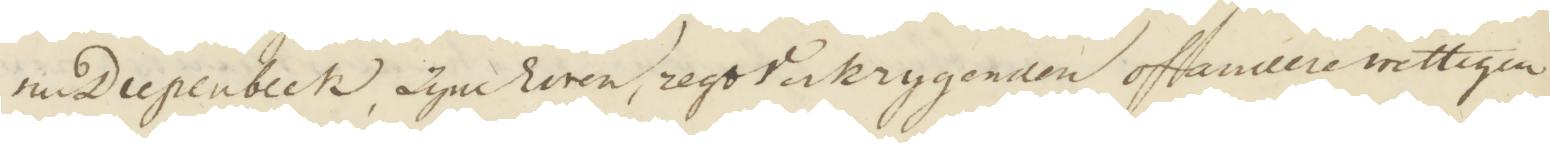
van Diepenbeek, zyne Eeren, regt Verkrygenden of andere wettigen
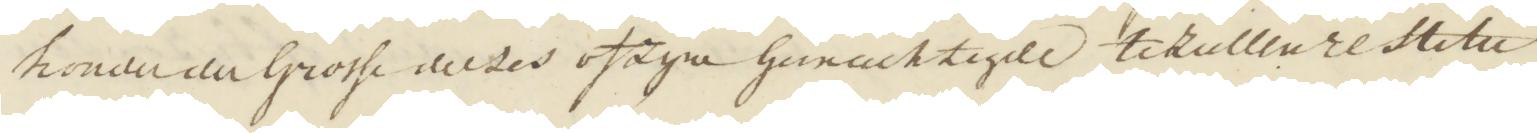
houdende Grosse deezes of zyne Geruchtigde te zullen restitu
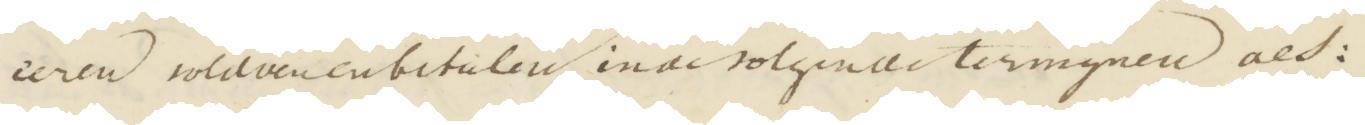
eeren voldoen en betalen, in de volgende termynen als:
